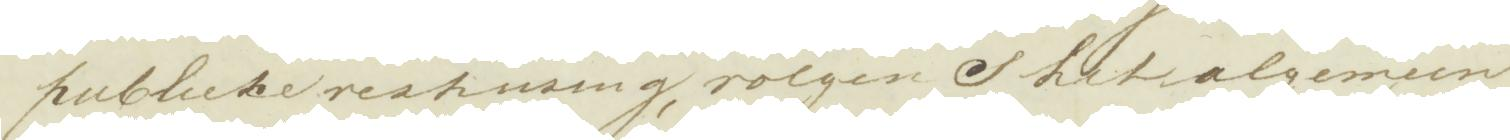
publieke verhuring, volgens het algemeen
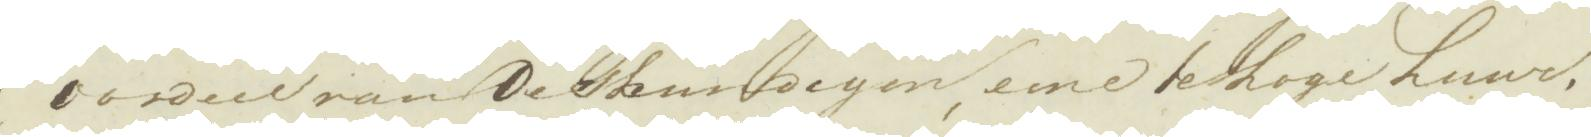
oordeel van deskundigen, eene te hoge huur„
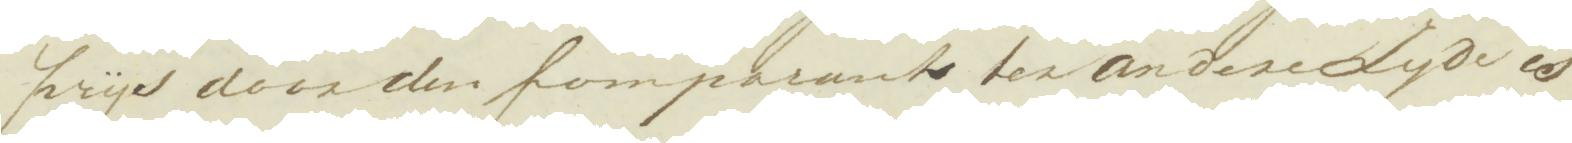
prijs door den Comparant ter andere Zyde is
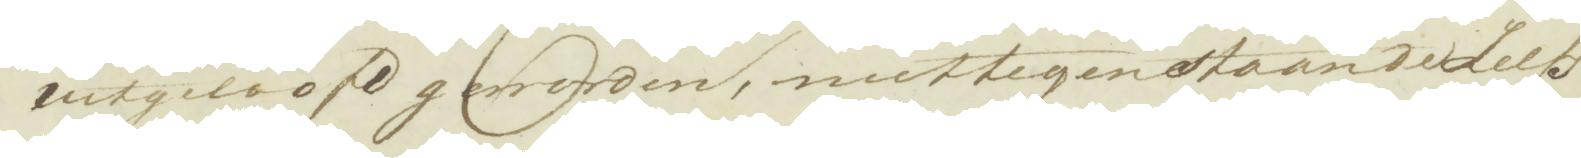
uitgeloofd geworden, niettegenstaande Zelfs
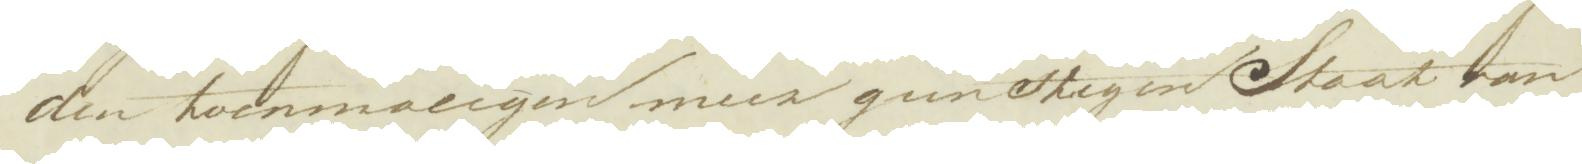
den toenmaligen meer gunstigen Staat van
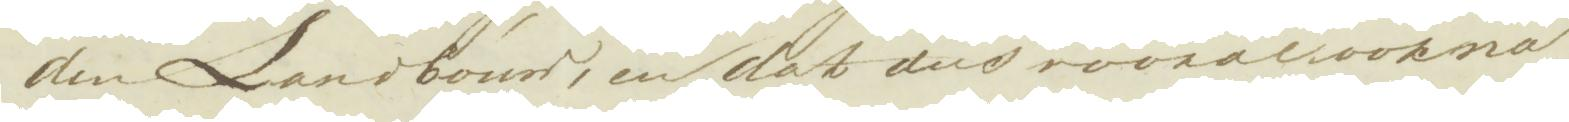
den Landbouw, en dat dus vooral ook na
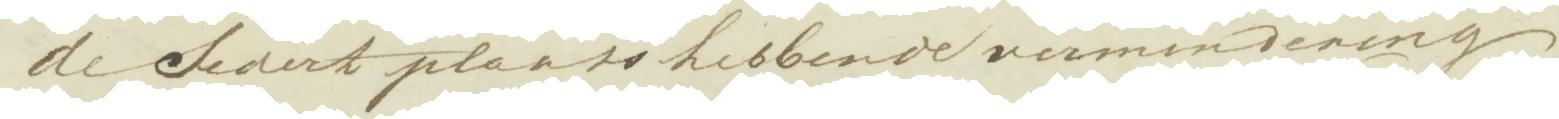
de Sedert plaats hebbende vermindering
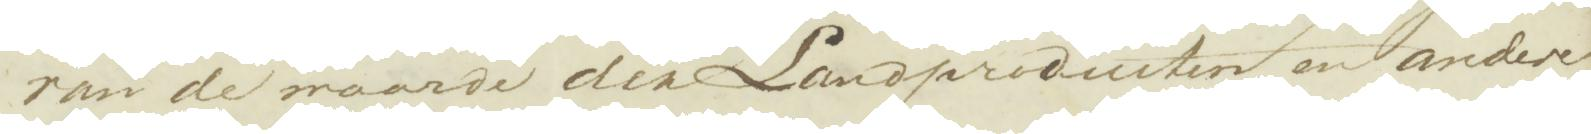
van de waarde der Landproducten en andere
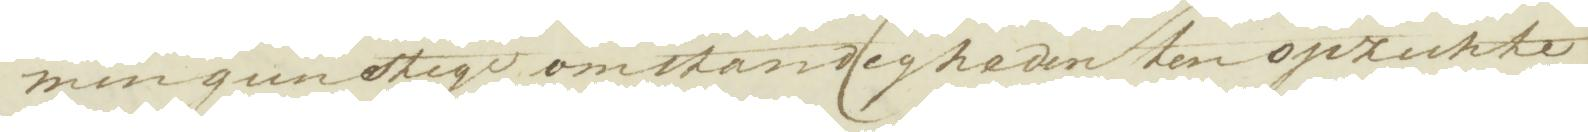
mingunstige omstandigheden ten opzichte
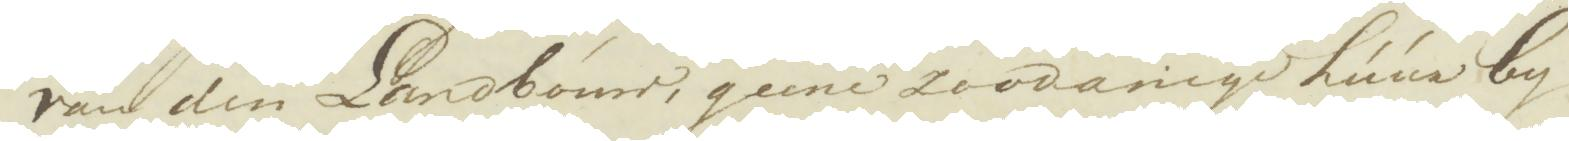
van den Landbouw, geene zoodanige huur by
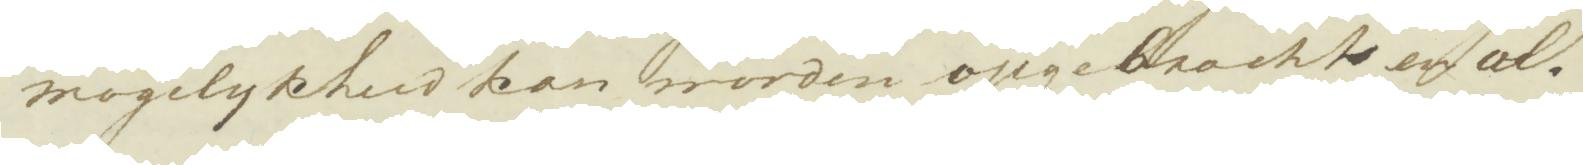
mogelykheid kan worden opgebracht en al„
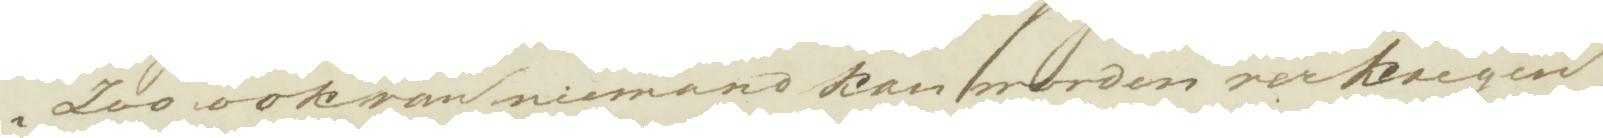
„zoo ook van niemand kan worden verkregen
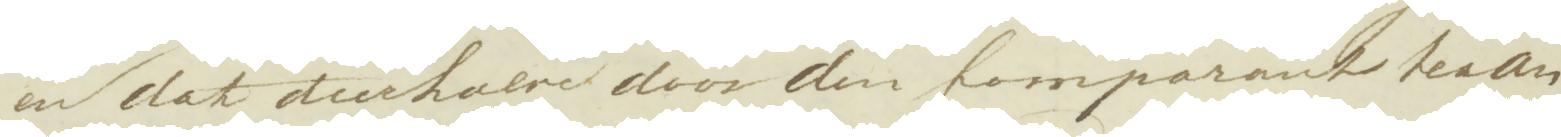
en dat dierhalve door den Comparant ter an
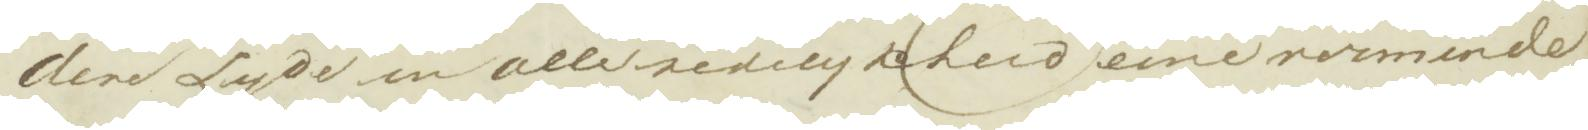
dere Zyde in alle redelykheid eene verminde
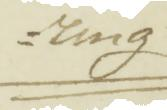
=ring
